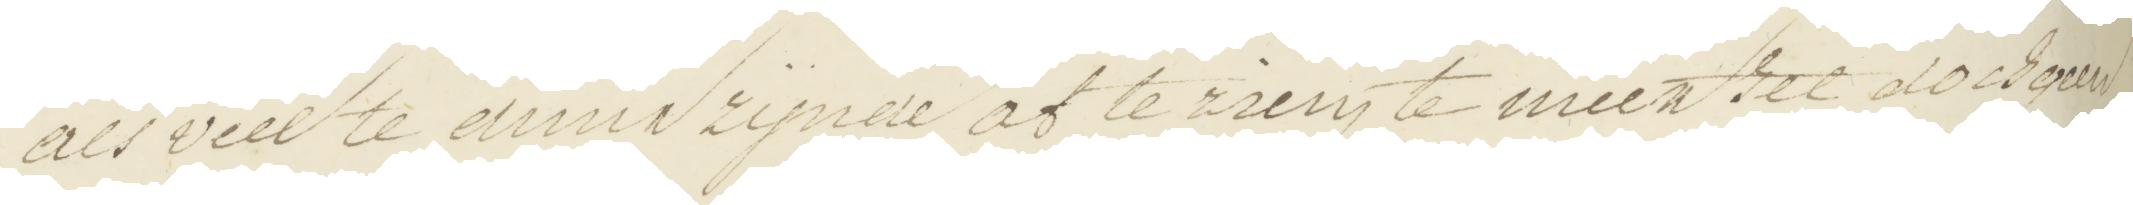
als veel te duur zijnde of te ruw te meer het doch geen
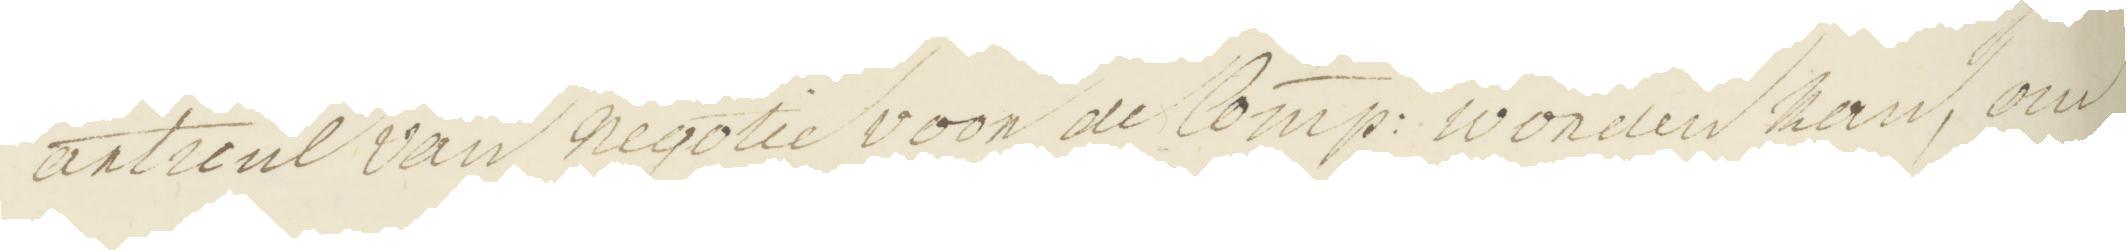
articul van negotie voor de Comp: worden kan, om
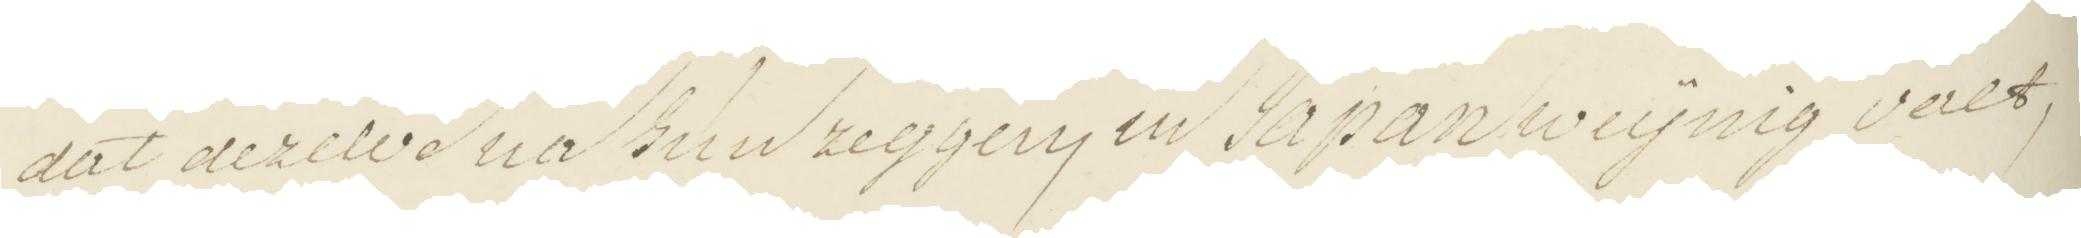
dat dezelve na hun zeggen in Japan weijnig valt,
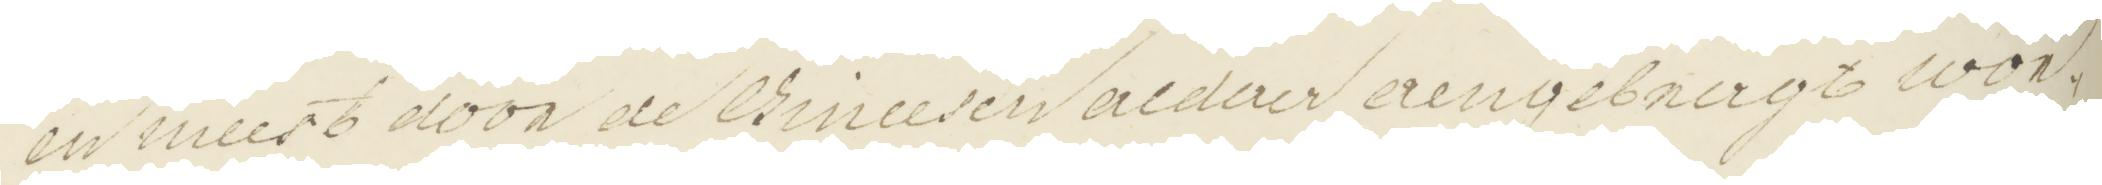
en meest door de chineesen aldaer aengebragt wor„
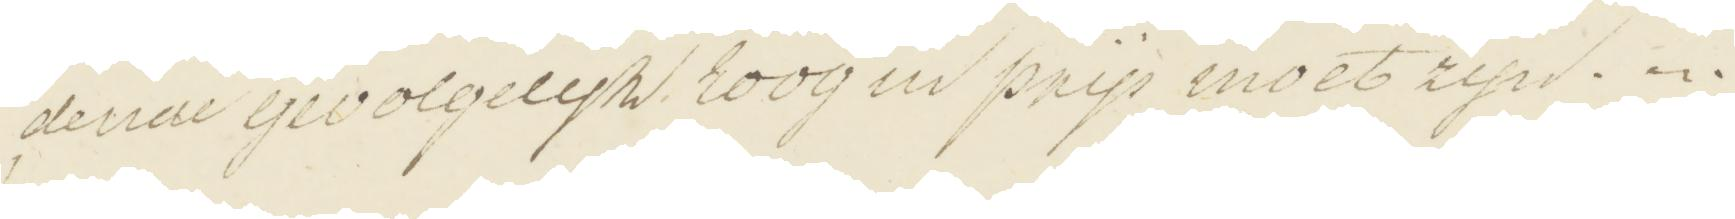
,dende gevolgelijk hoog in prijs moet zijn.
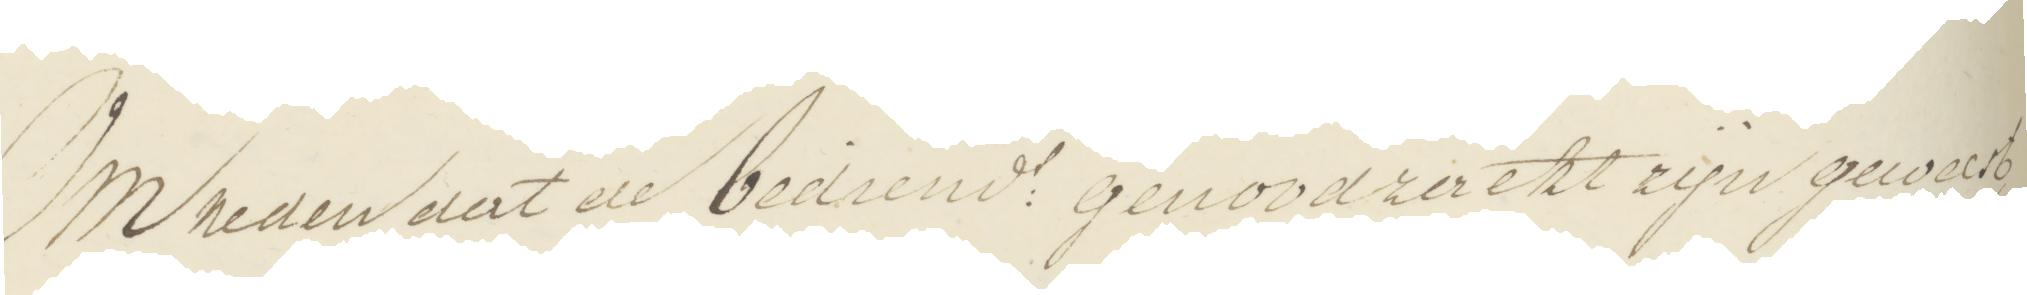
Om reden dat de bediene:s genoodzaekt zijn geweest
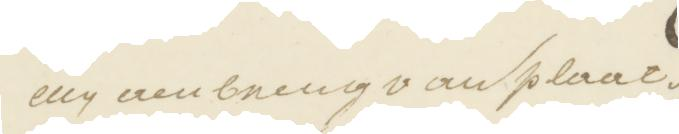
den aenbreng van plaat„
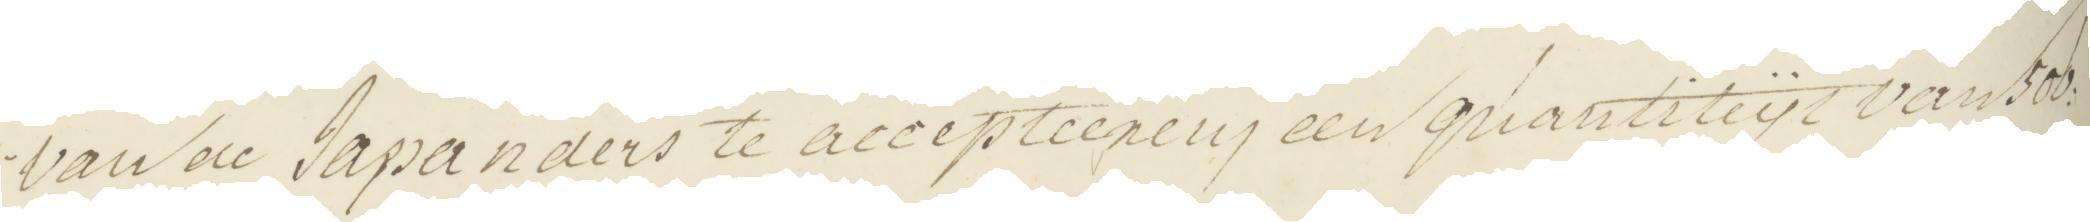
van de Japanders te accepteeren, een quantiteijt van 500:
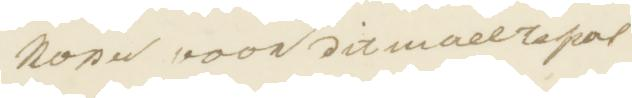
koper voor dit mael te pos
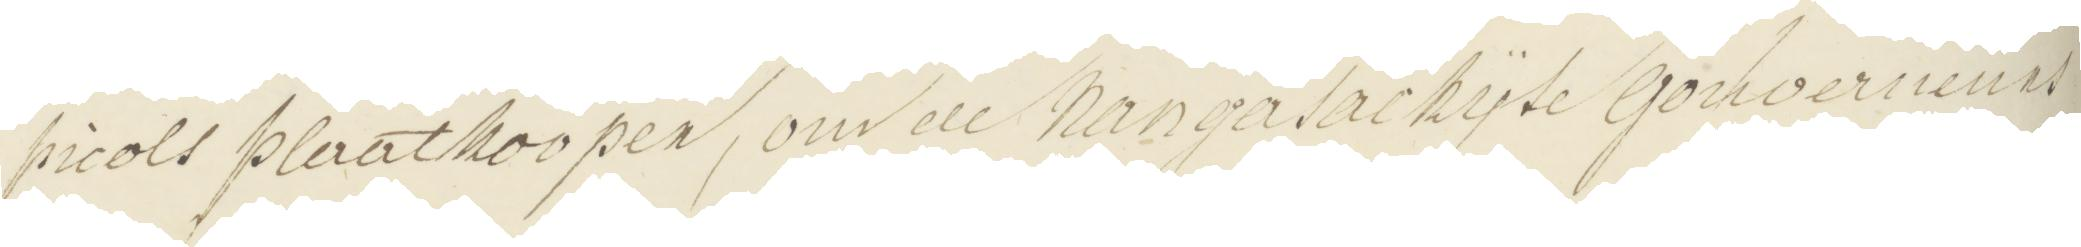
Picols plaatkooper, om de Nangasackijse gouverneurs
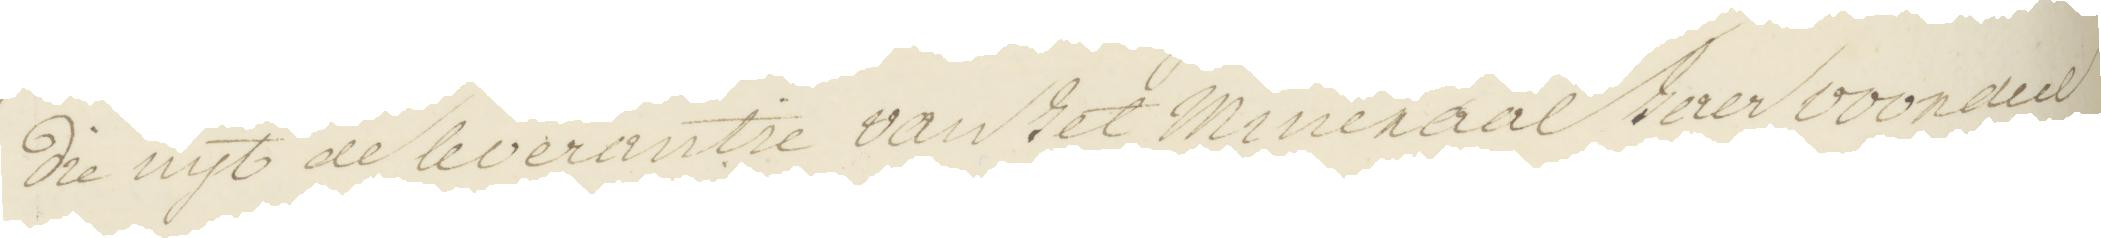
die uyt de leverantie van het mineraal haer voordeel
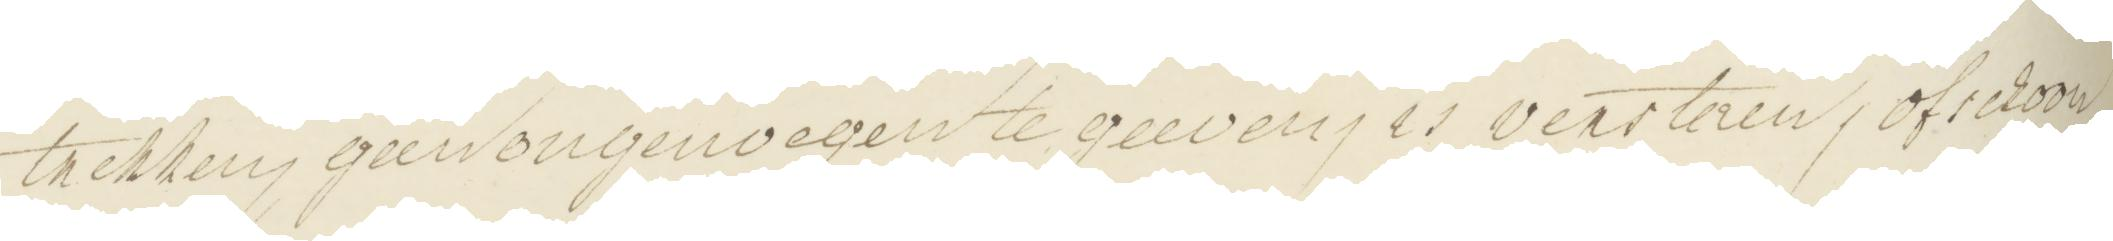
trekken, geen ongenoegen te geeven, is verstaen, ofschoon
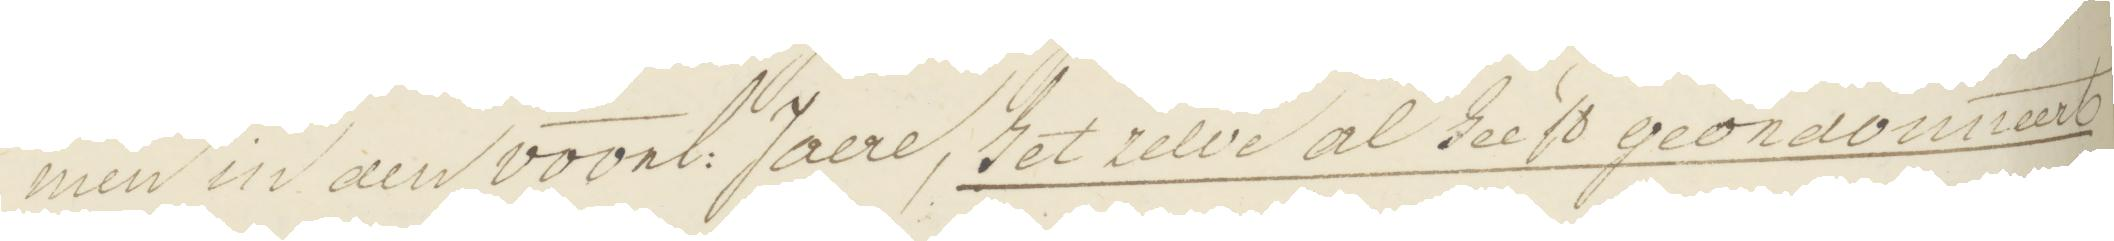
men in den voorl: Jaere, het zelve al heeft geordonneert
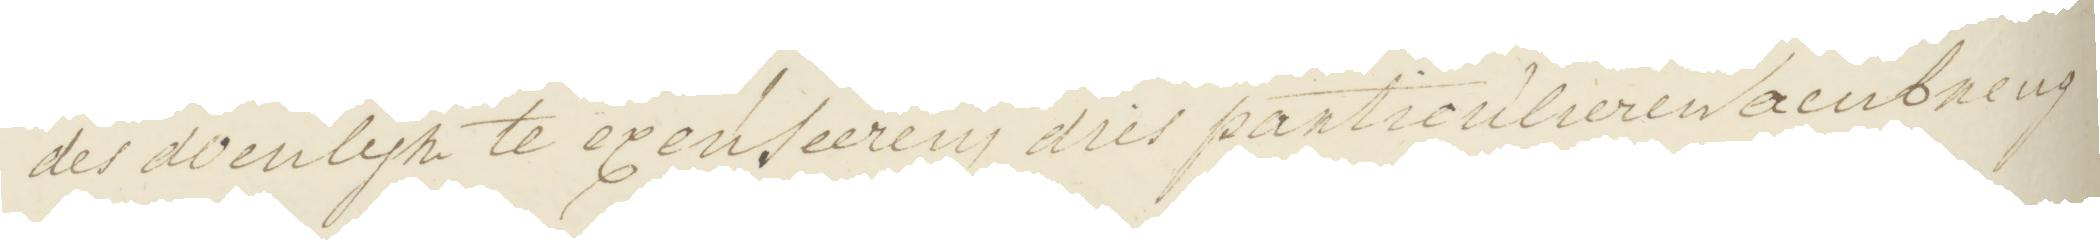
des doenlyk te excuseeren, dies particulieren aenbreng
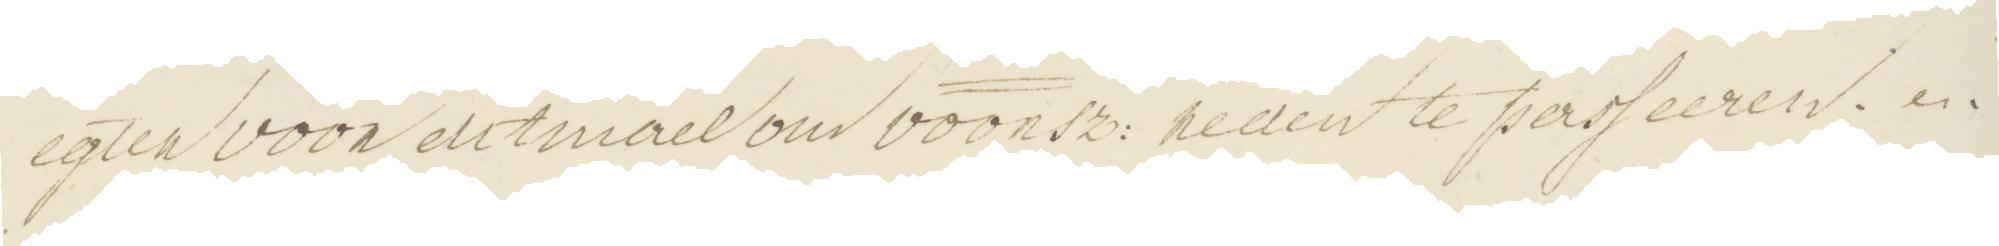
egter voor ditmael om voorsz: reden te passeeren.
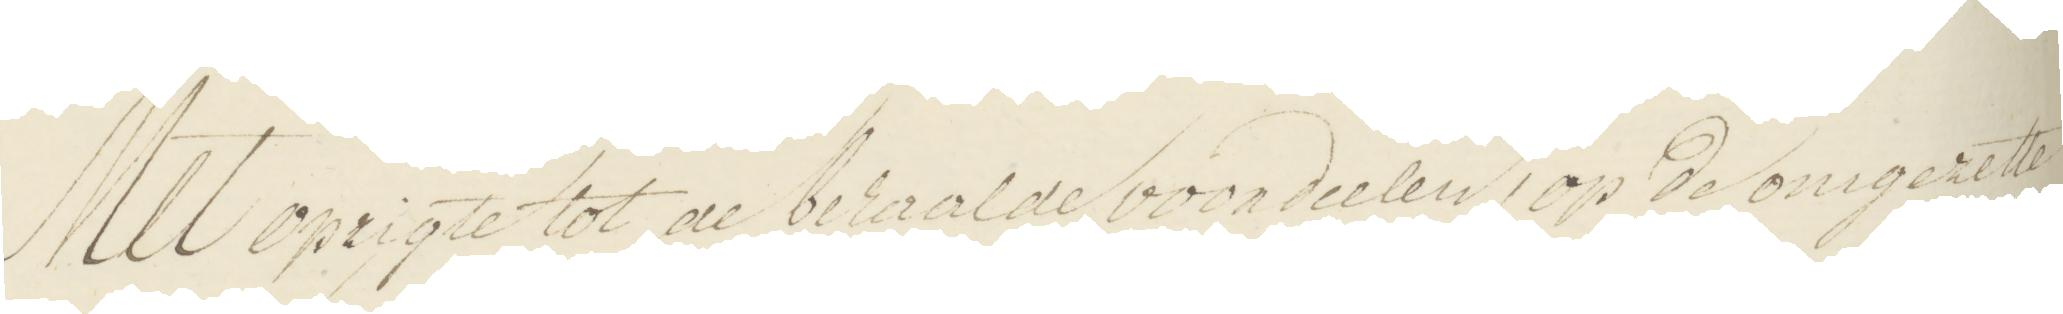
Met opzigte tot de behaalde voordeelen, op de omgezette
